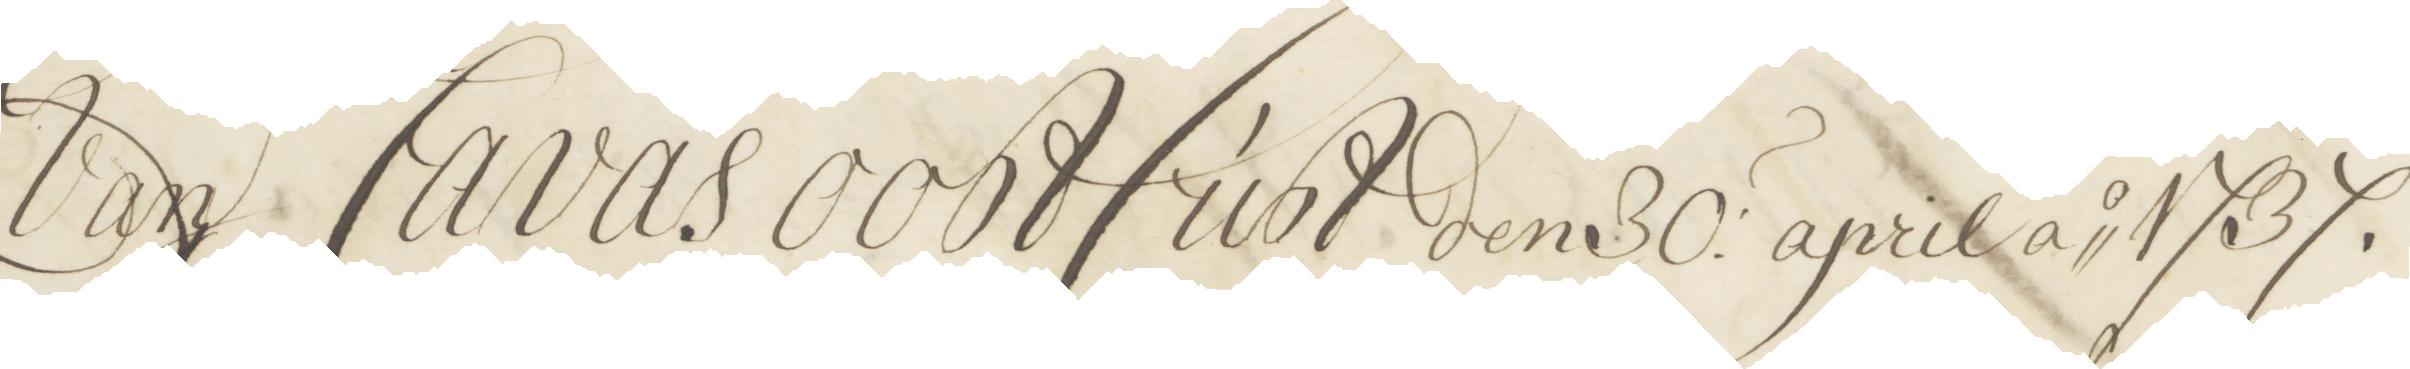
Van Java's oost Cust den 30:' april a„o 1737.
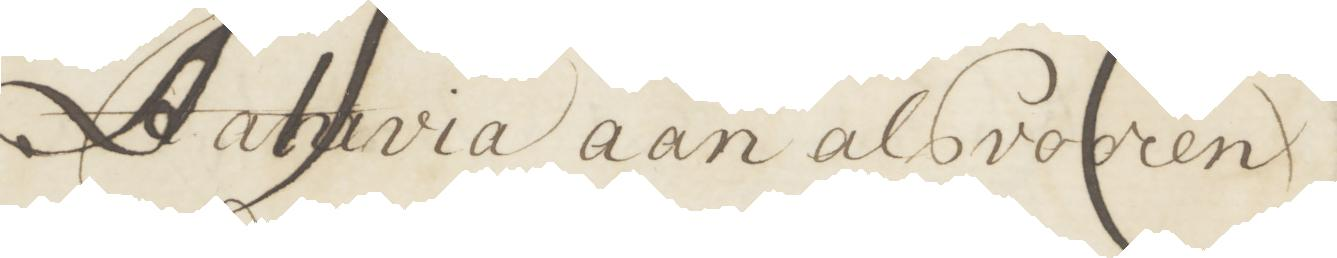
Batavia aan alsvooren
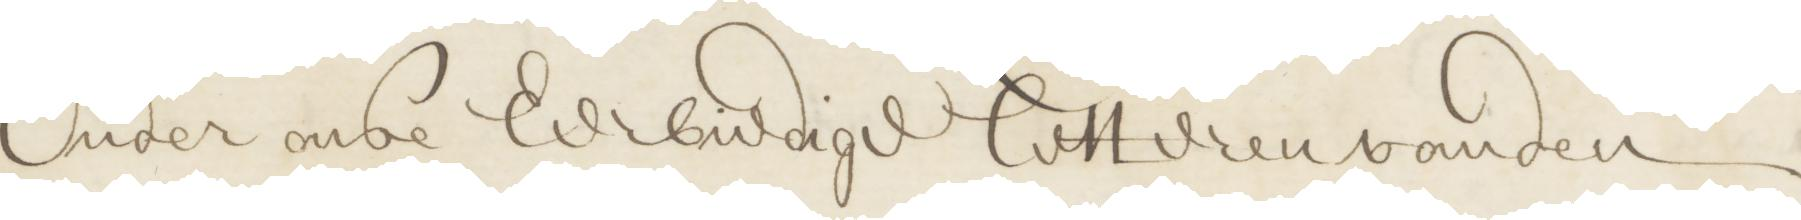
Onder onse Eerbiedige letteren van den
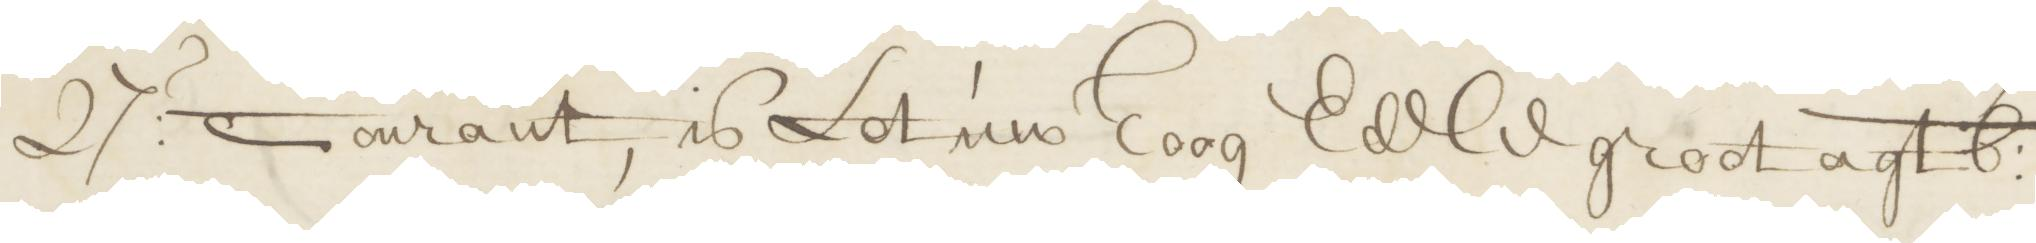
27:en courant, is tot uw hoog Edele groot agtb:
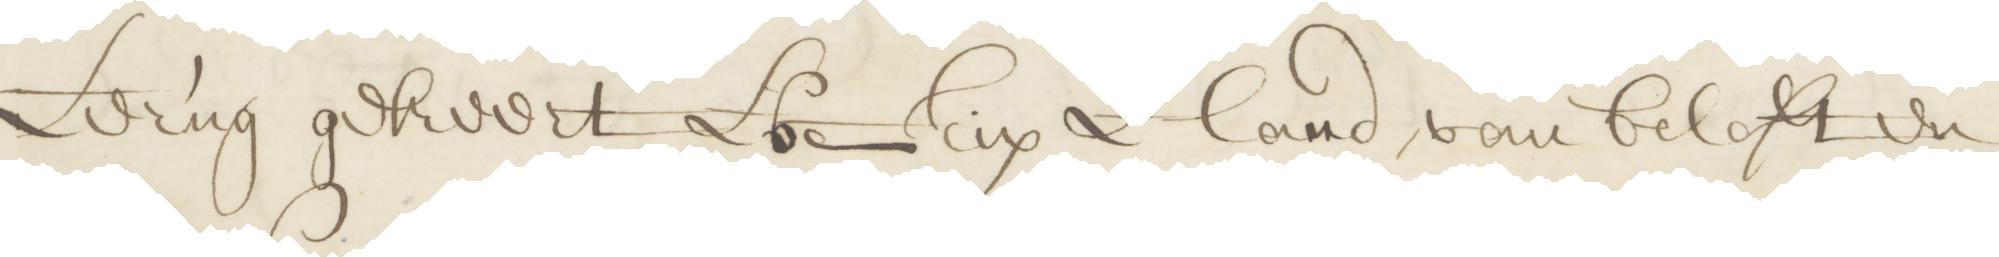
terug gekeert 'tschip 'tland van beloften
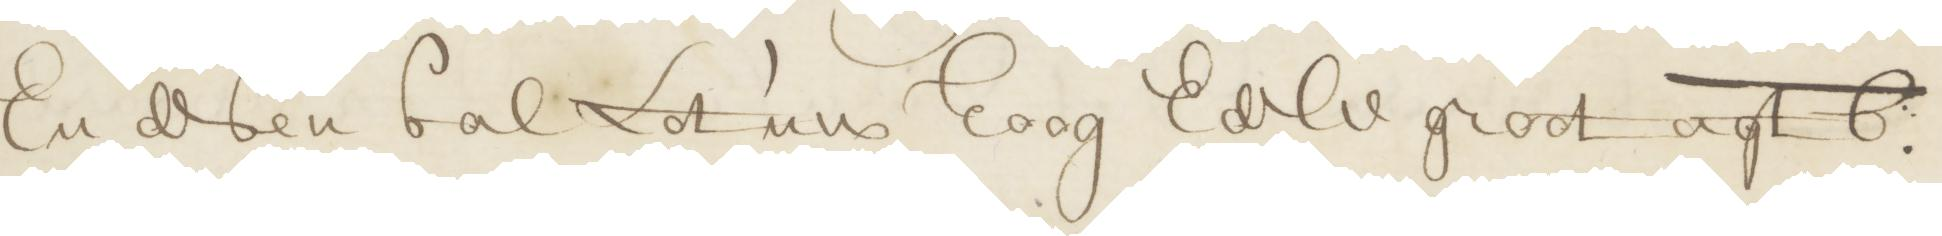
En desen sal tot uw hoog Edele groot agtb:
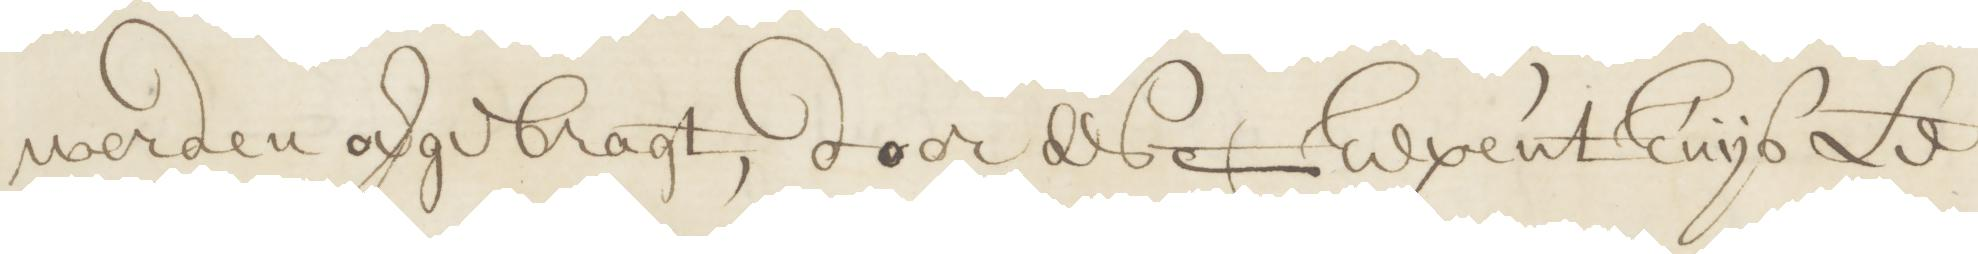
werden overgebragt, door deschepen't huijs te
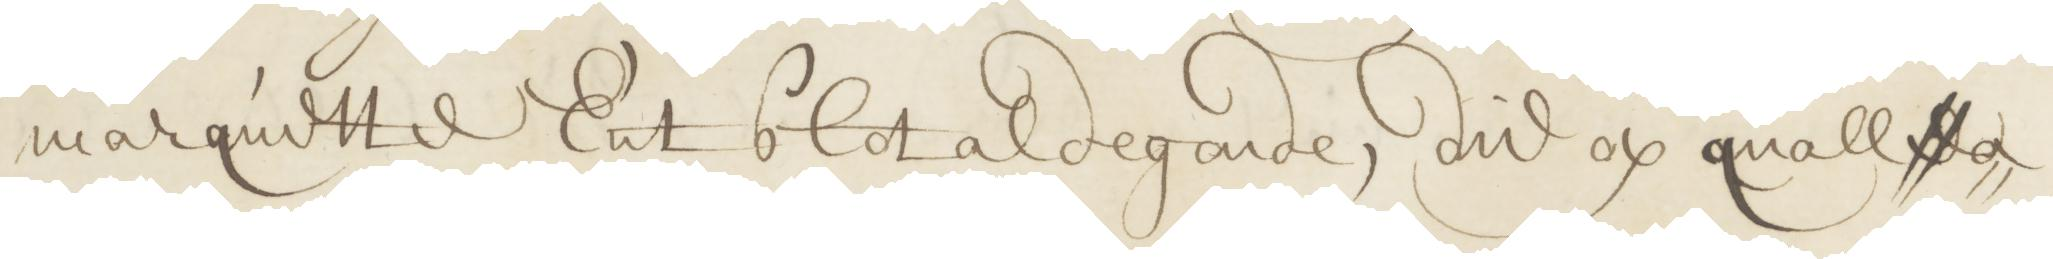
marquette En't slot aldegonde, die op quallea„
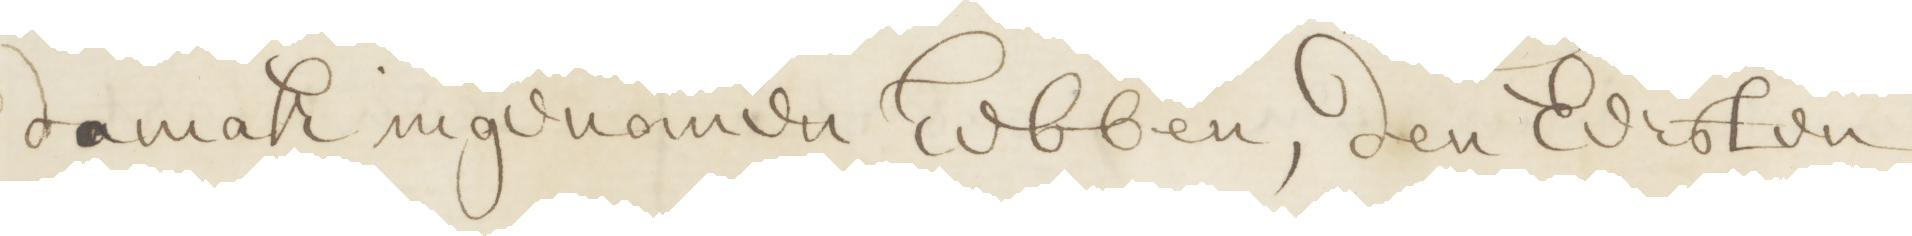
damak ingenomen hebben, den Eersten
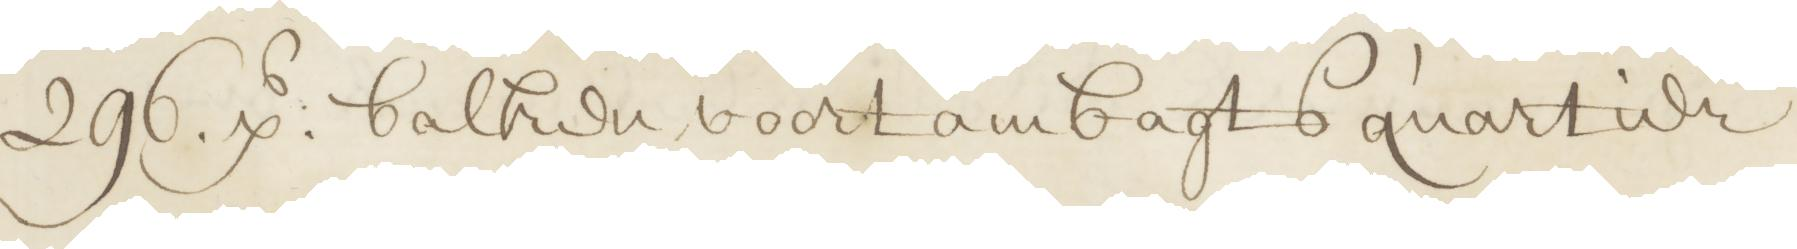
296. p:s balken voor't ambagts quartier
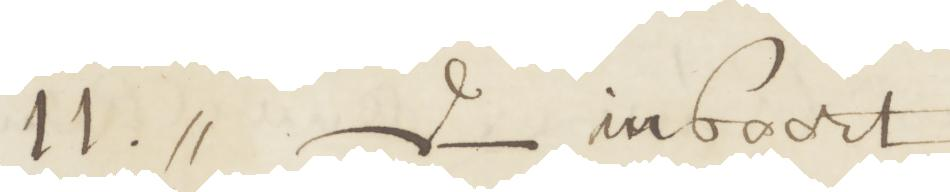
11. „ d_ insoort
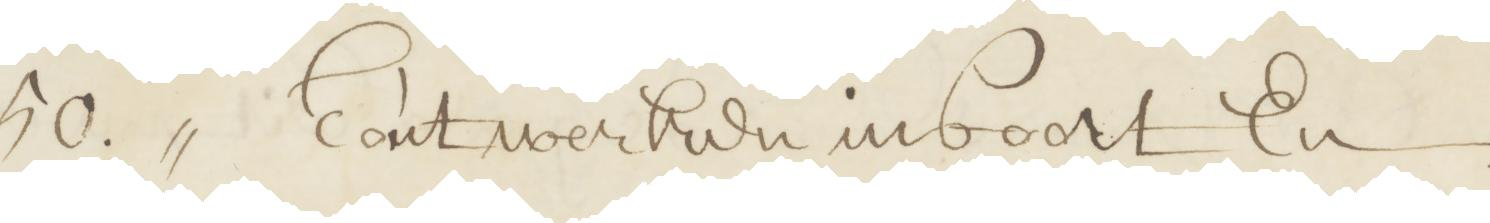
50. „ hout werken insoort En
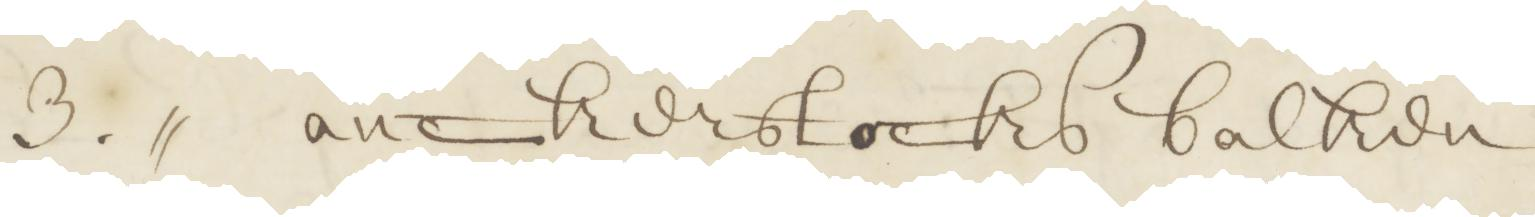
3. „ anckerstocks balken
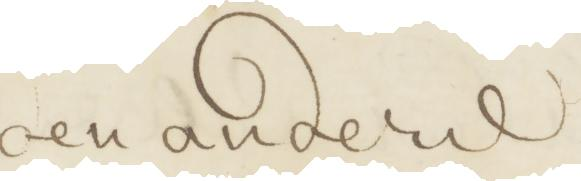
den andere
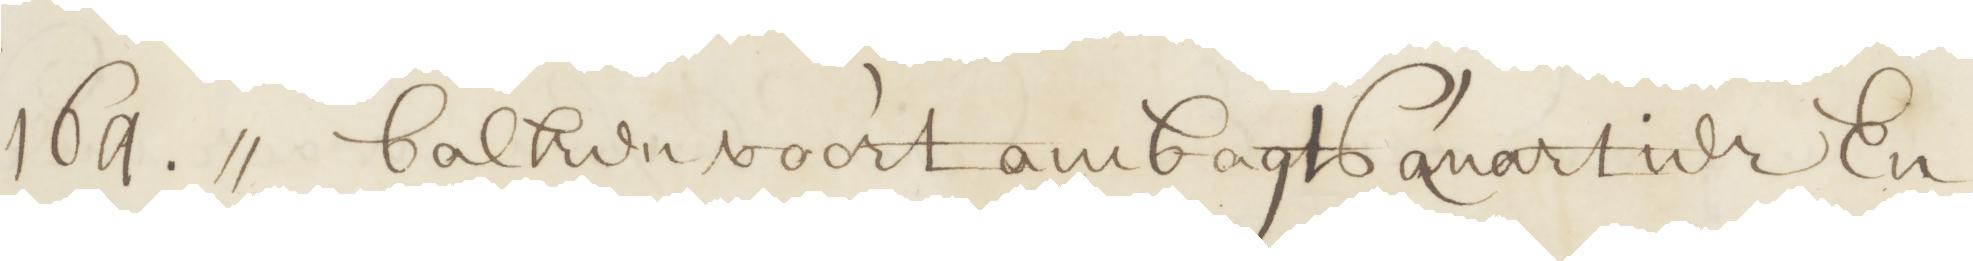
164. „ balken voor't ambagts quartier En
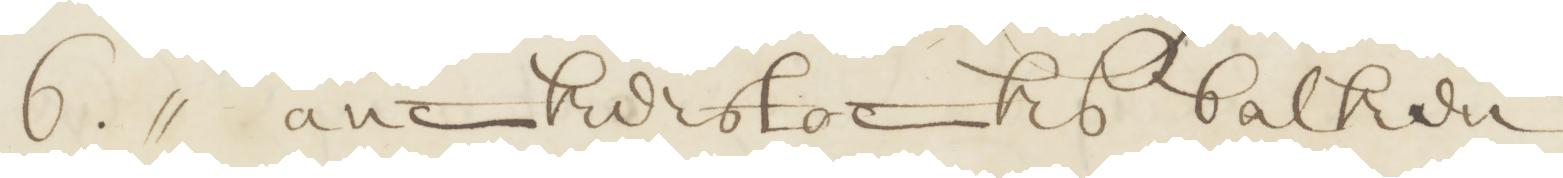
6. „ anckerstocks balken
